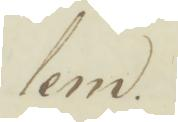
=lem.
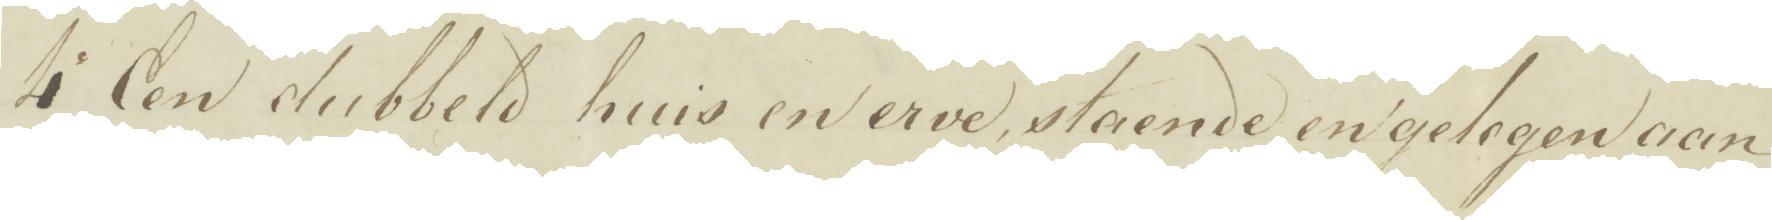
4.o Een dubbeld huis en erve, staende en gelegen aan
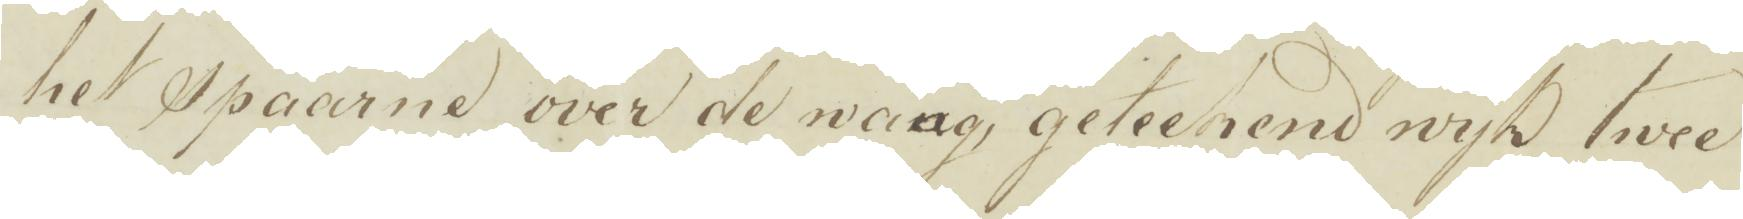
het spaarne over de waag, geteekend wyk twee
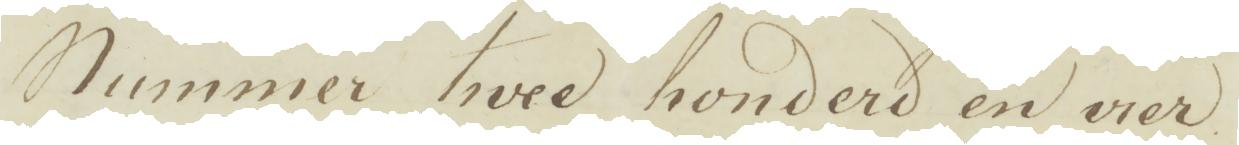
Nummer twee honderd en vier
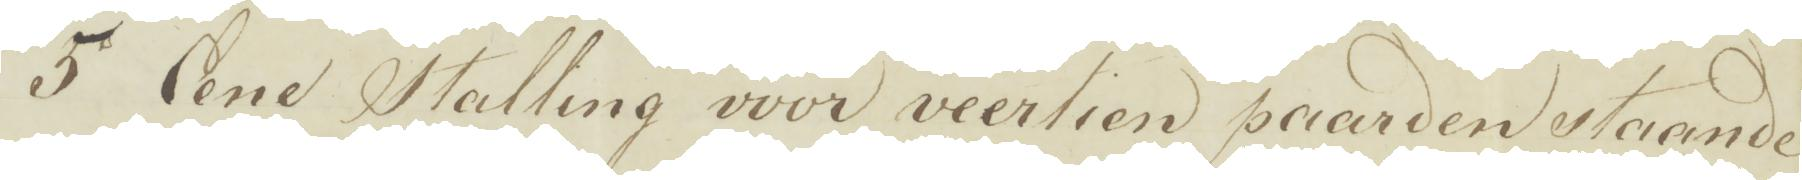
5o Eene Stalling voor veertien paarden staande
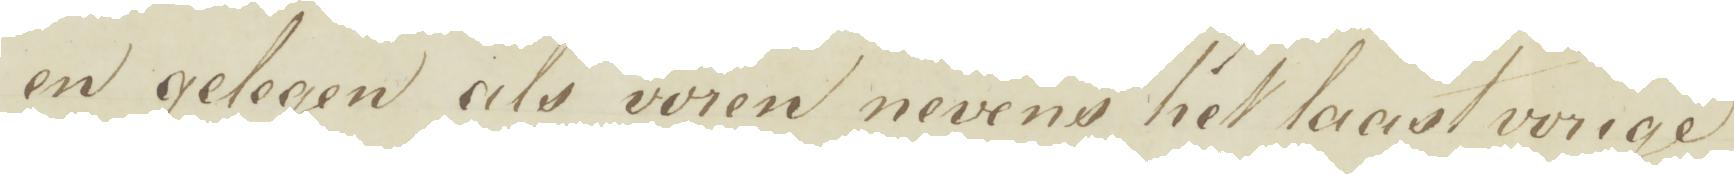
en gelegen als voren nevens het laast vorige
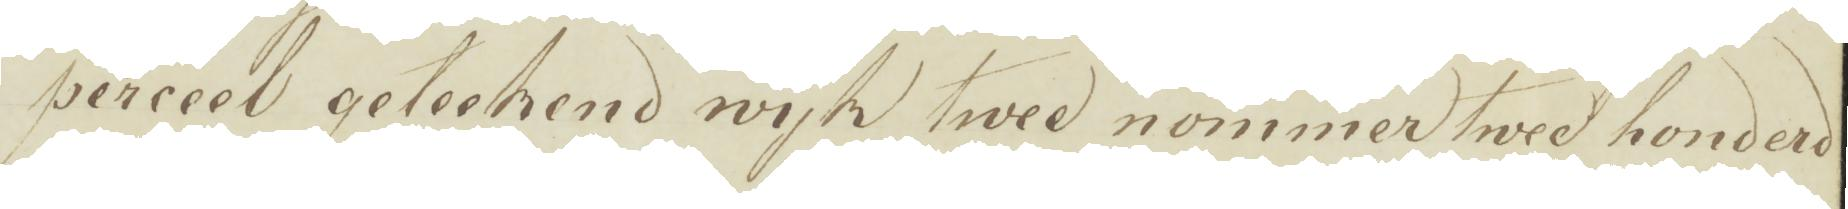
perceel geteekend wyk twee nommer twee honderd
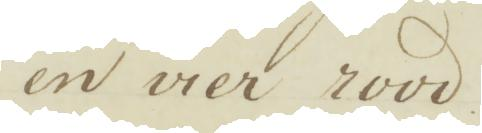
en vier rood
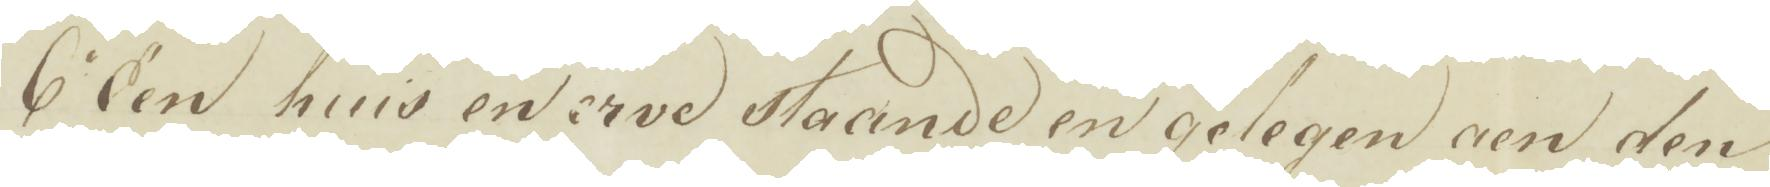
6' Een huis en erve staande en gelegen aen den
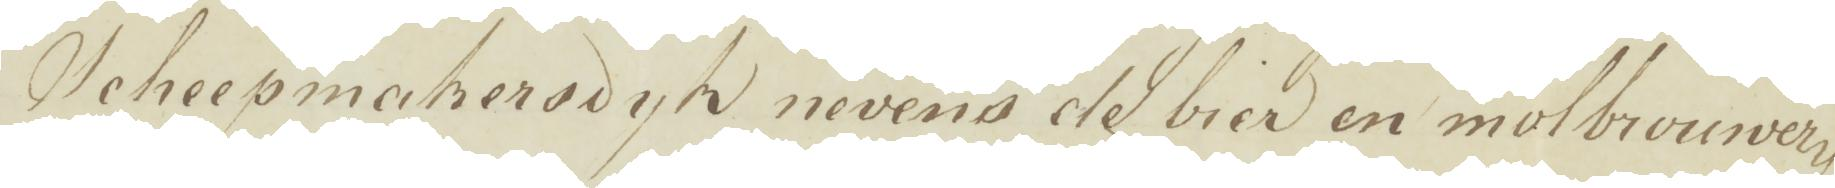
Scheepmakersdyk nevens de bier en molbrouwery
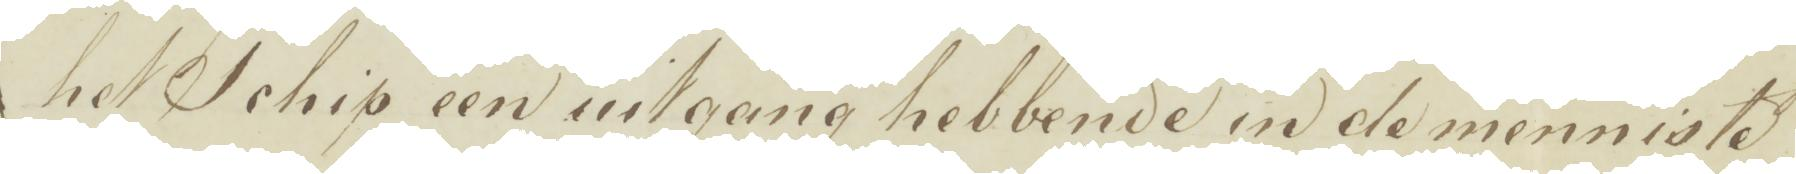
het Schip een uitgang hebbende in de menniste
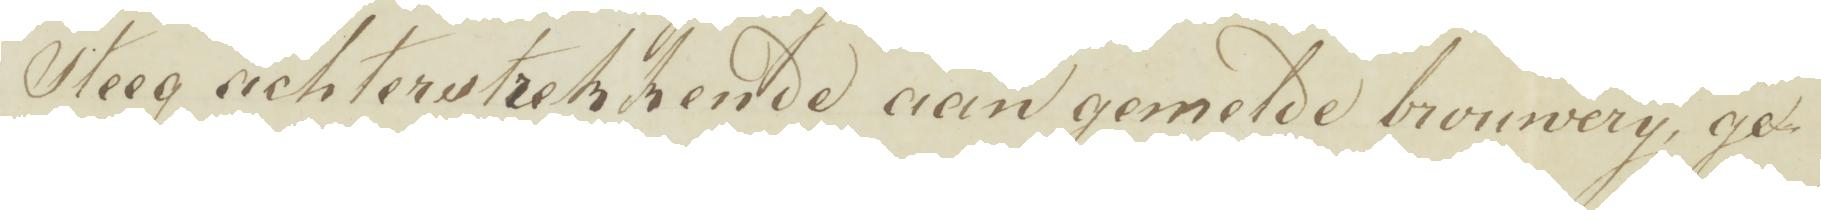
Steeg achterstrekkende aan gemelde brouwery, ge„
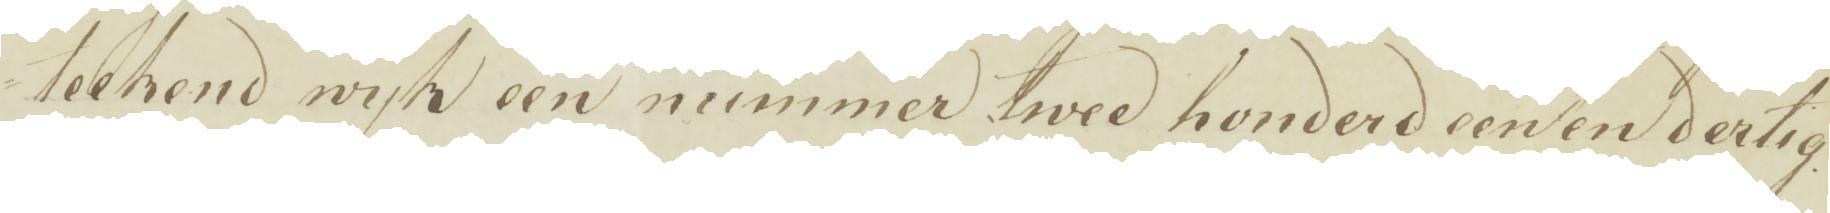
teekend wyk een nummer twee honderd een en dertig.
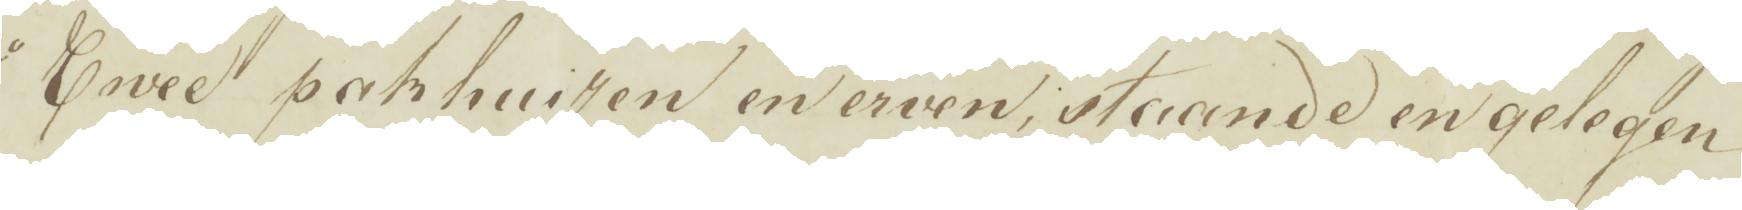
7'o Twee pakhuizen en erven, staande en gelegen
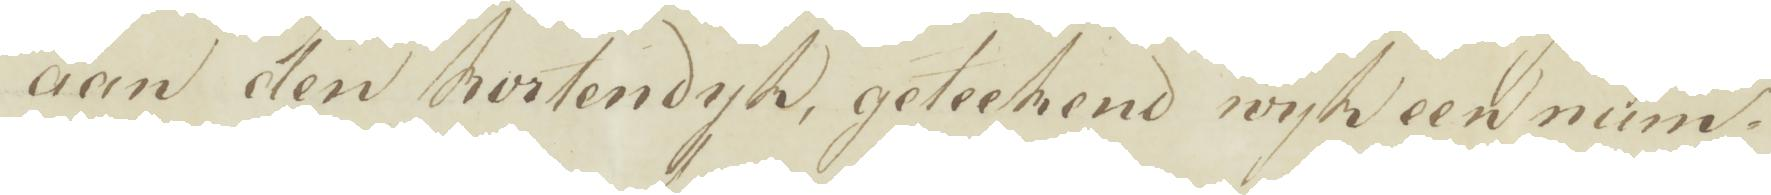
aan den kortendyk, geteekend wyk een num„
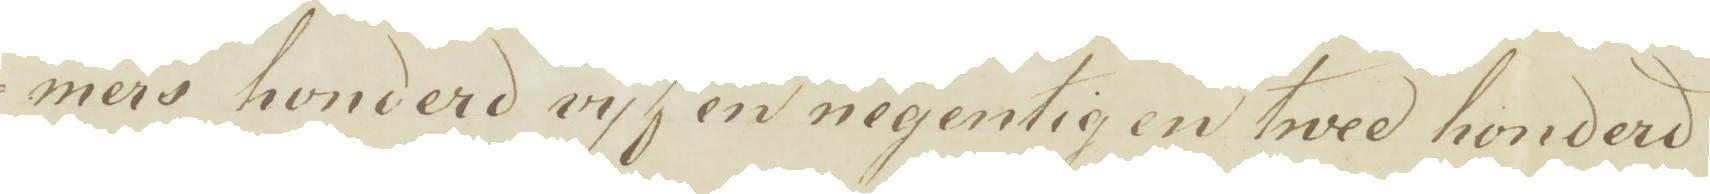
=mers honderd vyf en negentig en twee honderd
